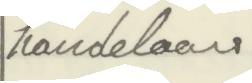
kandelaars
